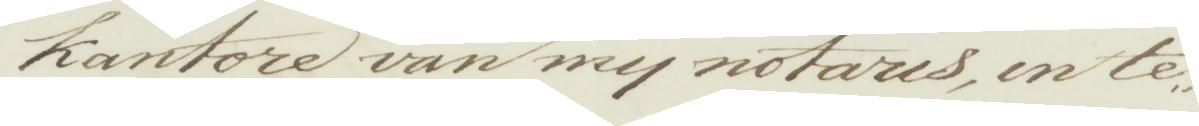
kantore van my notaris, in te
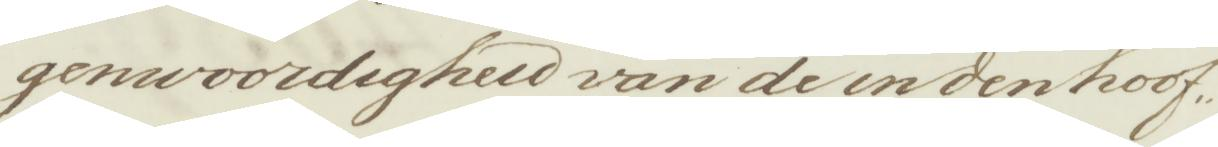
genwoordigheid van de in den hoof„
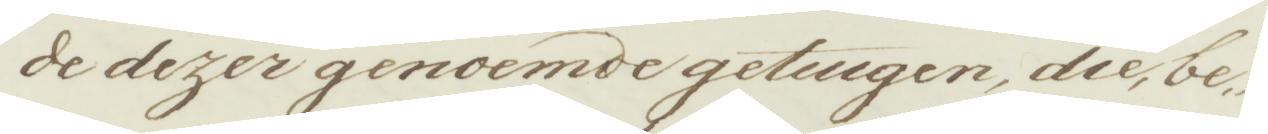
de dezer genoemde getuigen, die, be„
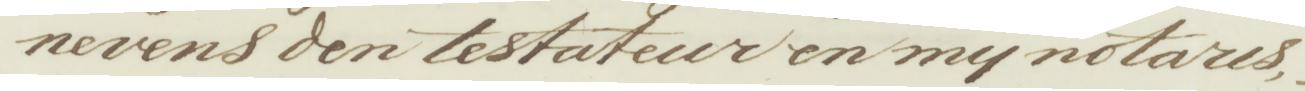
nevens den testateur en my notaris,
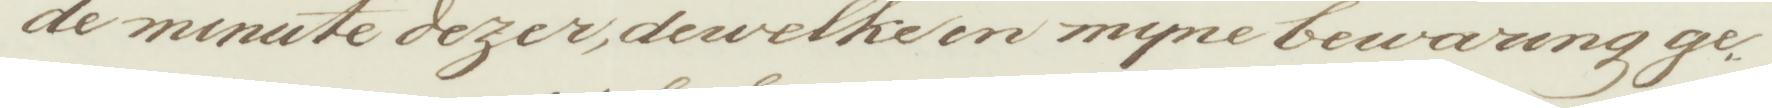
de minute dezer, dewelke in myne bewaring ge„
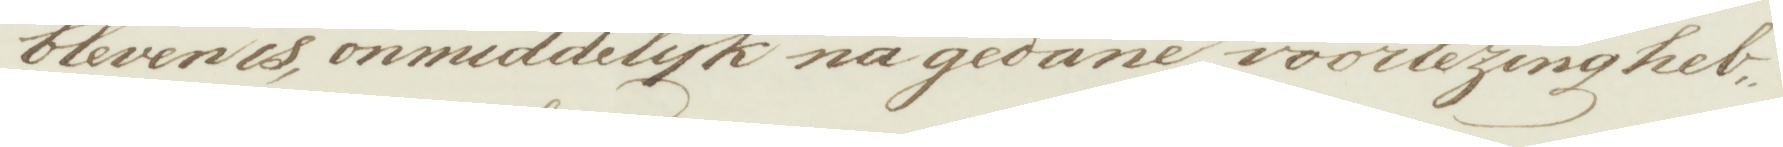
bleven is, onmiddelyk na gedane voorlezing heb„
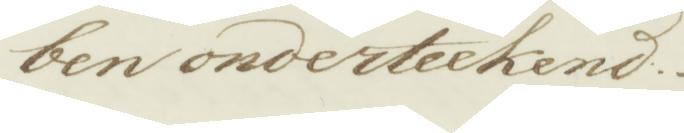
ben onderteekend:
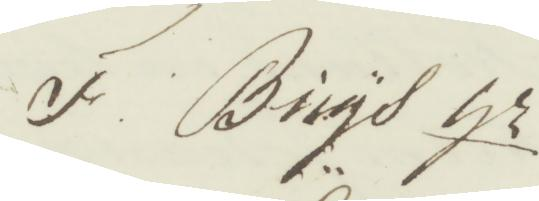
F. Buijs jr
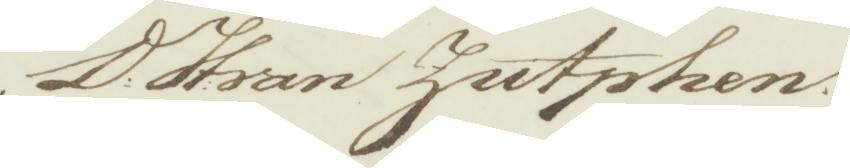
D. H van Zutphen.
